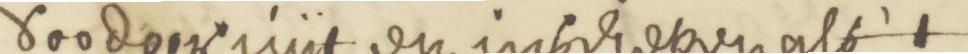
Soo doer uijt en inschepen als ’t
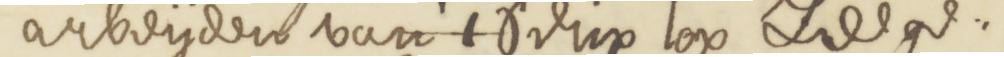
arbeijden van ’t Schip op Zee ge„
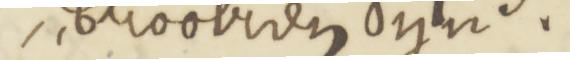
brooken Sijn.
